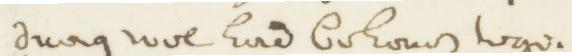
drag wel had behoren tege.
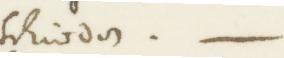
schieden.
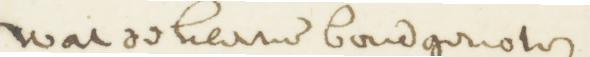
wat de kleene bondgenoten
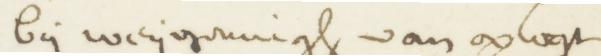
bij weijgeringh van optogt
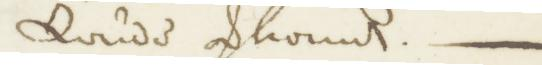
Zoude verkomen.
